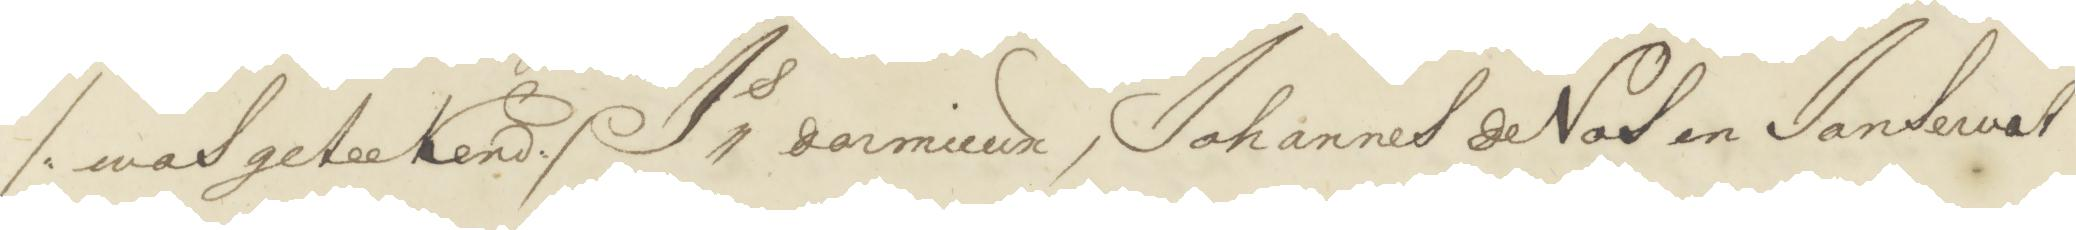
/:was geteekend:/ I„s darmieux, Iohannes de Nos en Ian servas
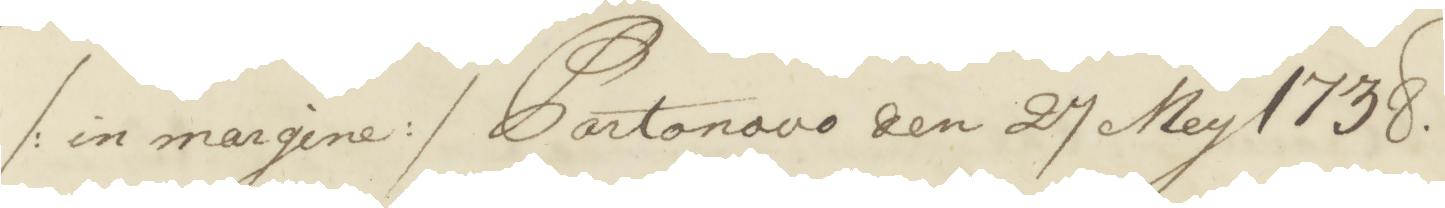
/:in margine:/ Portonovo den 27 Mey 1738.
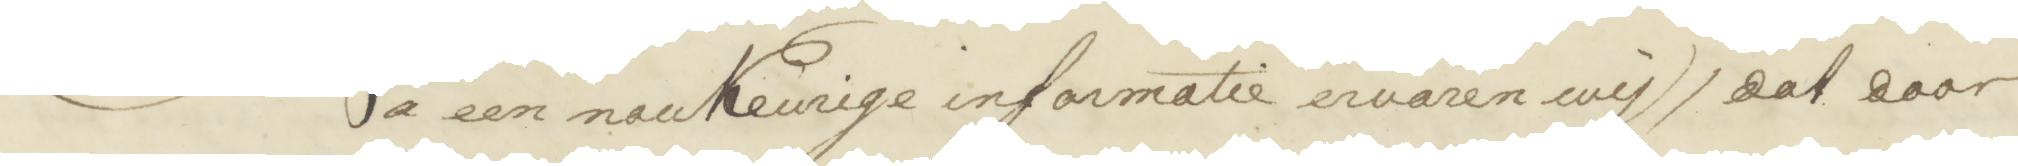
Na een naukeurige informatie ervaren wij, dat door
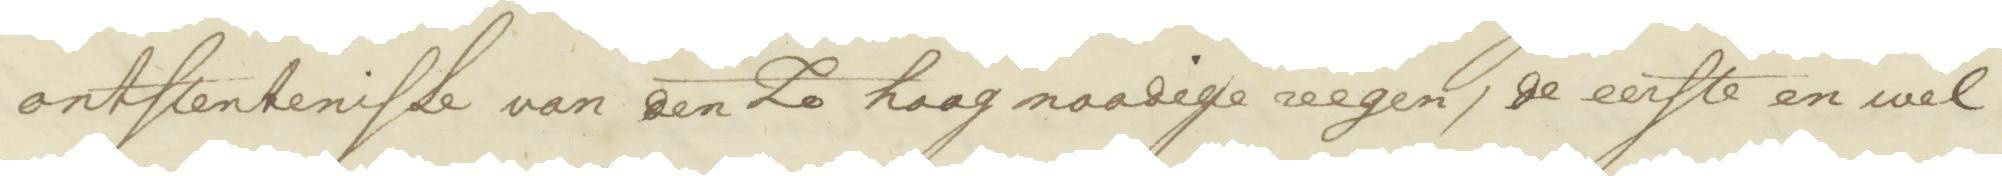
ontstentenisse van den zo hoog noodige reegen, de eerste en wel
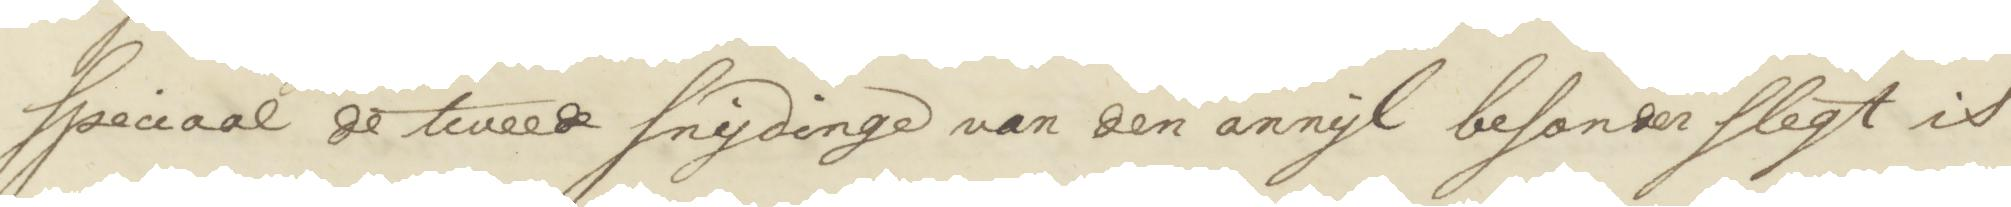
speciaal de tweede snijdinge van den annijl besonder slegt is
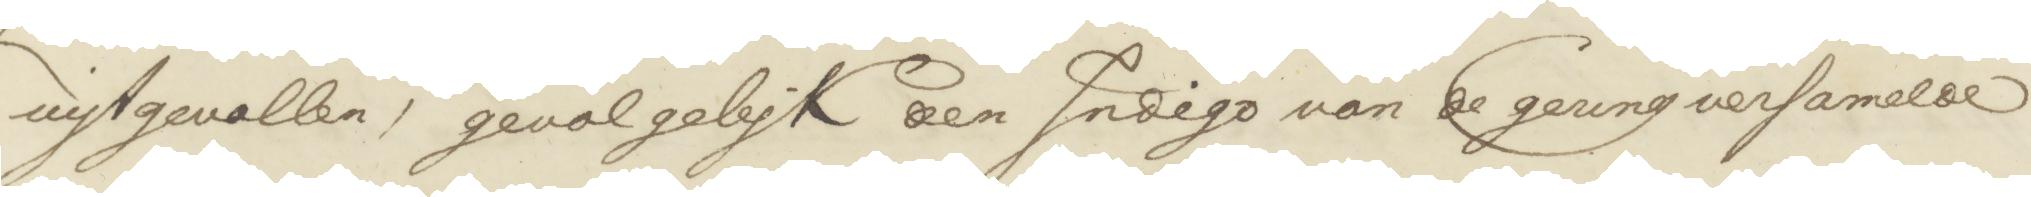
uijtgevallen, gevolgelijk den Indigo van de gering versamelde
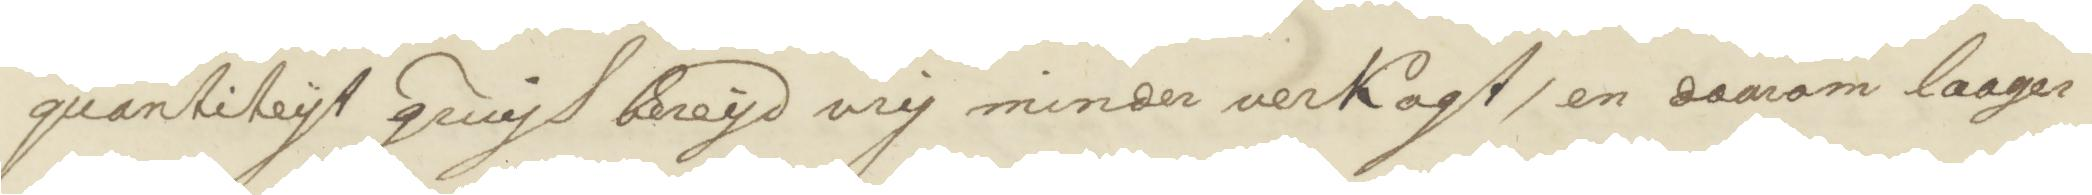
quantiteijt gruijs bereijd vrij minder verkogt, en daarom laager
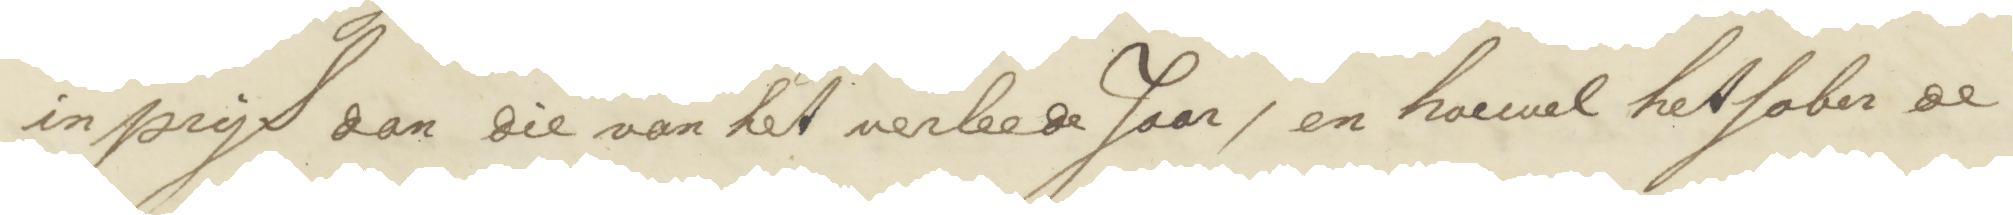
in prijs dan die van het verleede Jaar, en hoewel het sober de
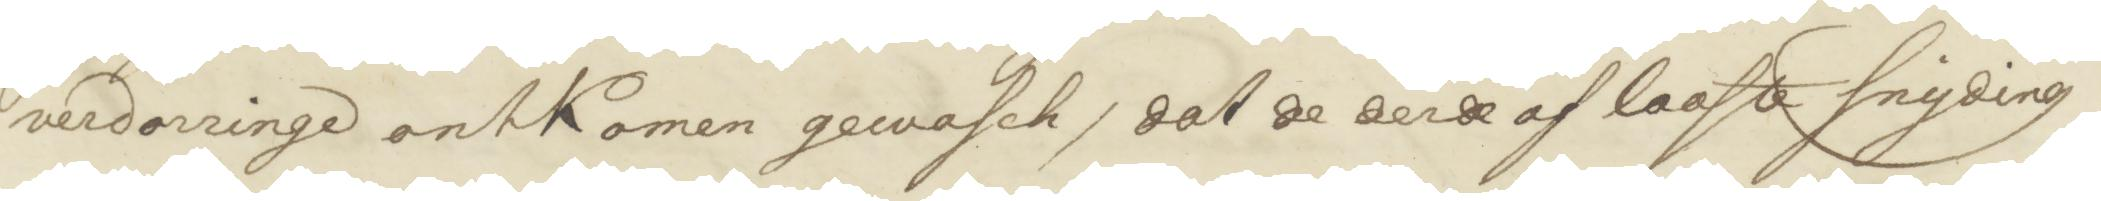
verdorringe ontkomen gewasch, dat de derde of laaste snijding
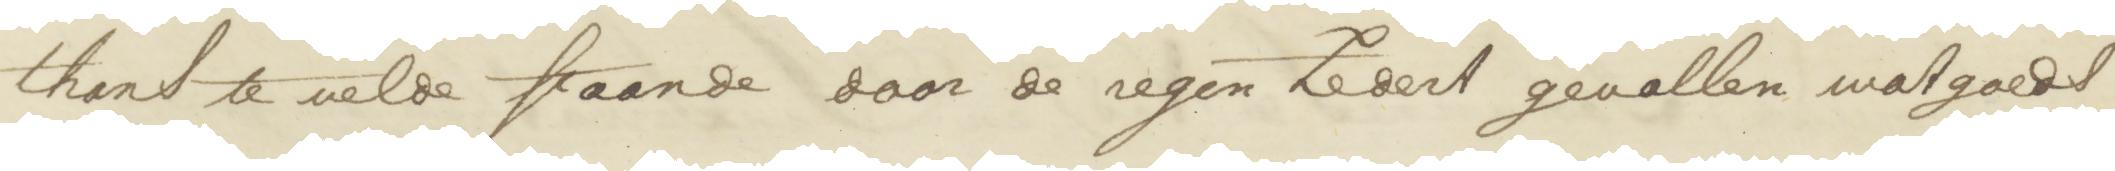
thans te velde staande door de regen zedert gevallen wat goeds
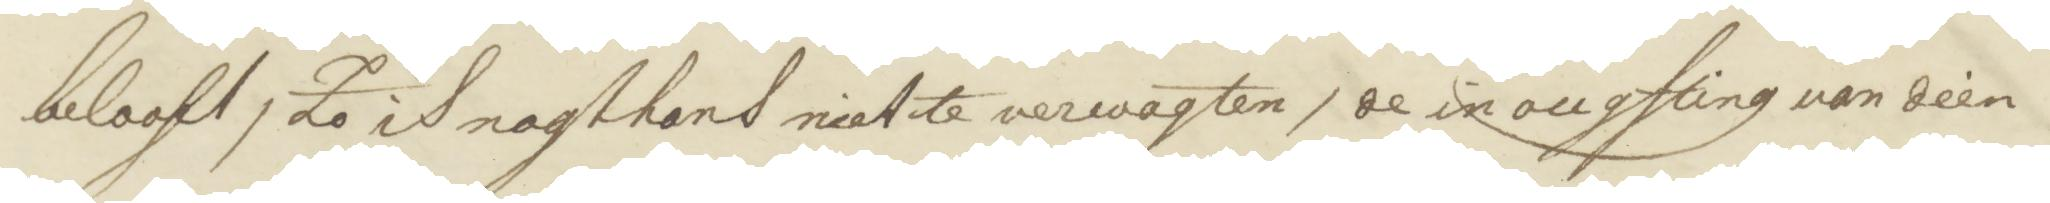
belooft, zo is nogthans niet te verwagten, de in ougsting van dien
